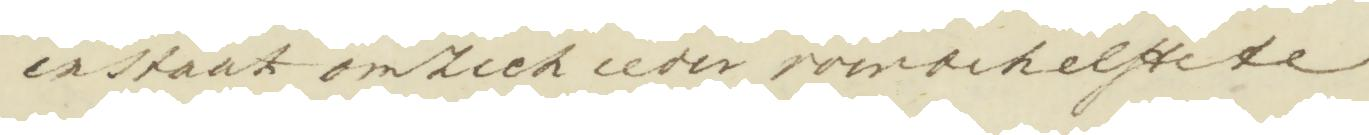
in staat om zich ieder voor de helfte te
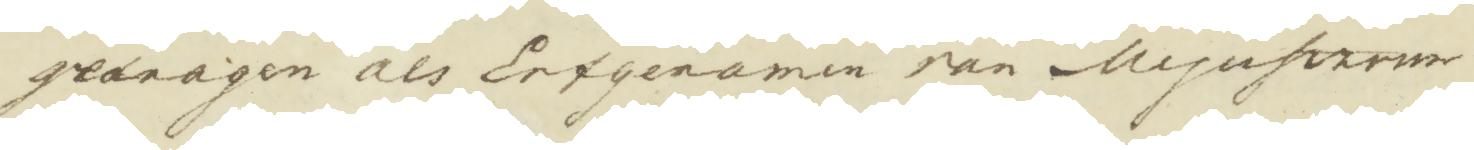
gedragen als Erfgenamen van Mejufvrouw
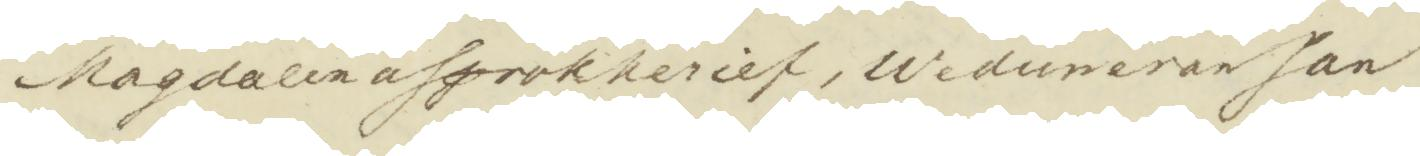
Magdalena sprokkerief, weduwe van Jan
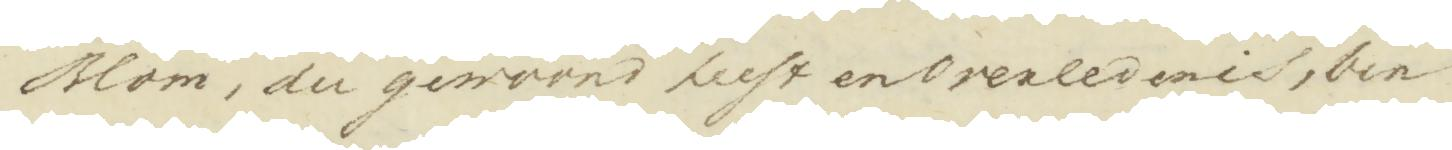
Blom, die gewoond heeft en overleden is, bin
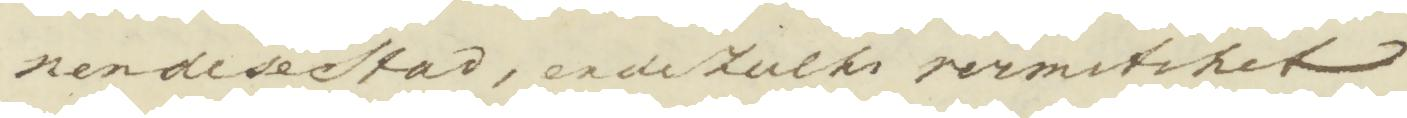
nen dese stad, ende zulks vermits het
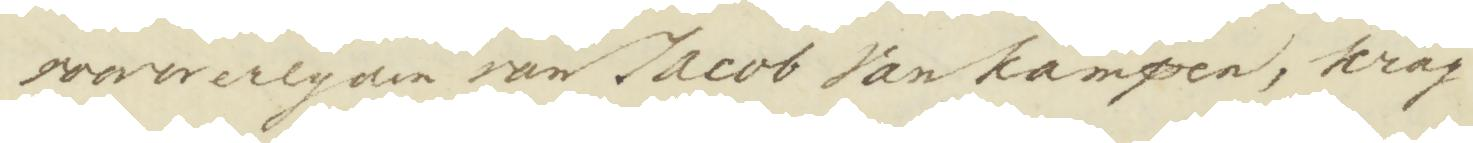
vooroverlyden van Iacob Van kampen, krag
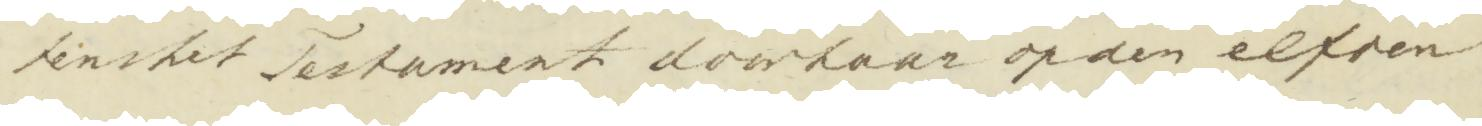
tens het Testament door haar op den elfden
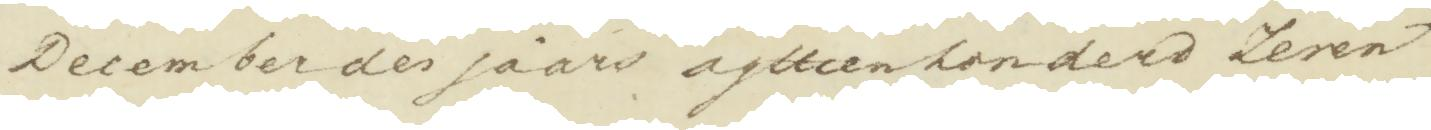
December der jaars agttien honderd zeven
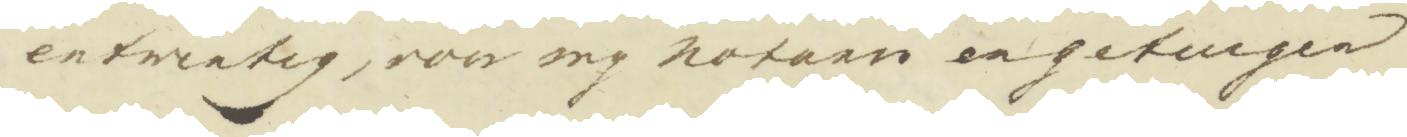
en twintig, voor my notaris en getuigen
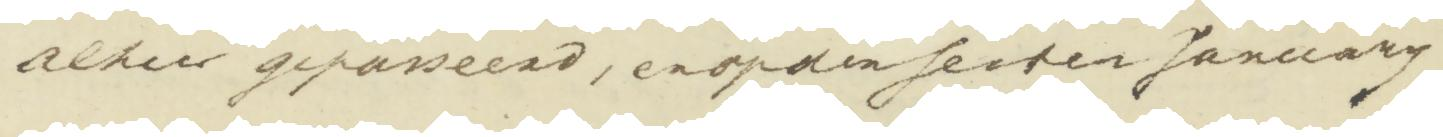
alhier gepasseerd, en op den sesten January
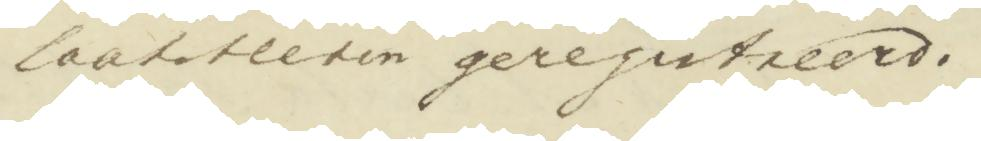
laatstleden geregistreerd.
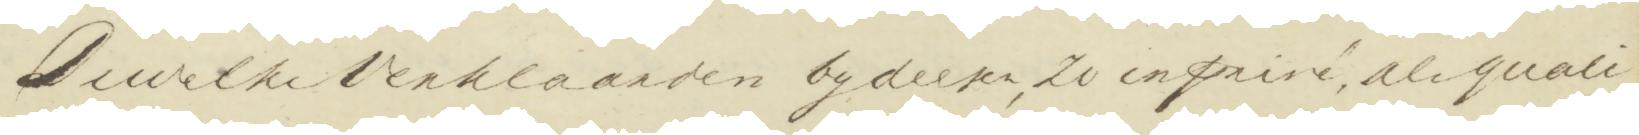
Dewelke verklaarden by deeser, zo in privé, als quali
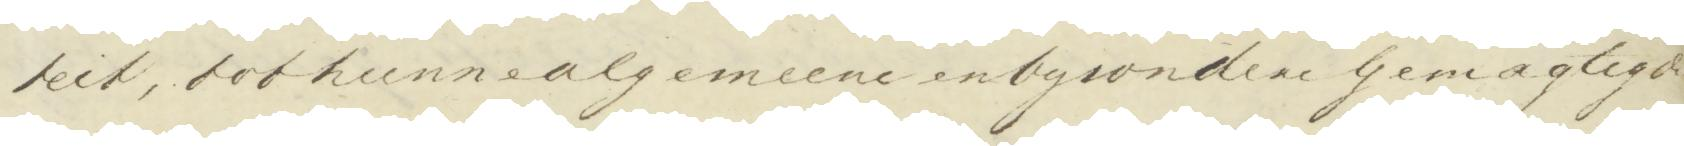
teit, tot hunne algemeene en bysondere gemagtigd
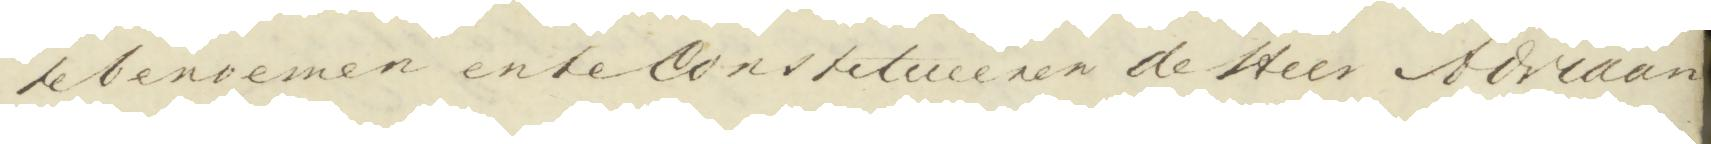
te benoemen en te Constitueeren de Heer Adriaan
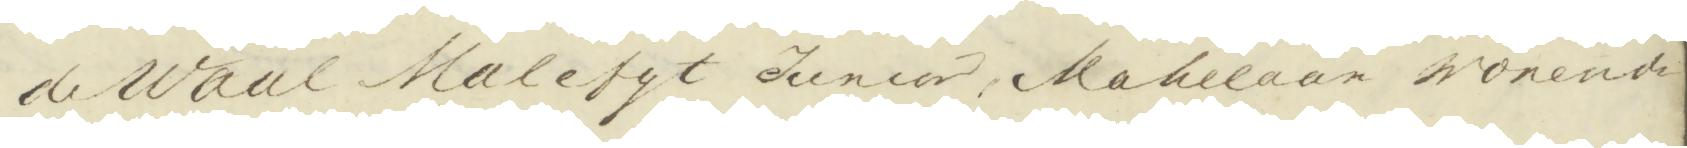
de Waal Malefyt Iunior, Makelaar wonende
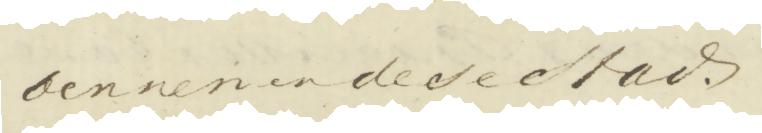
binnen in dese stad.
